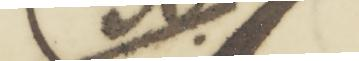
38:
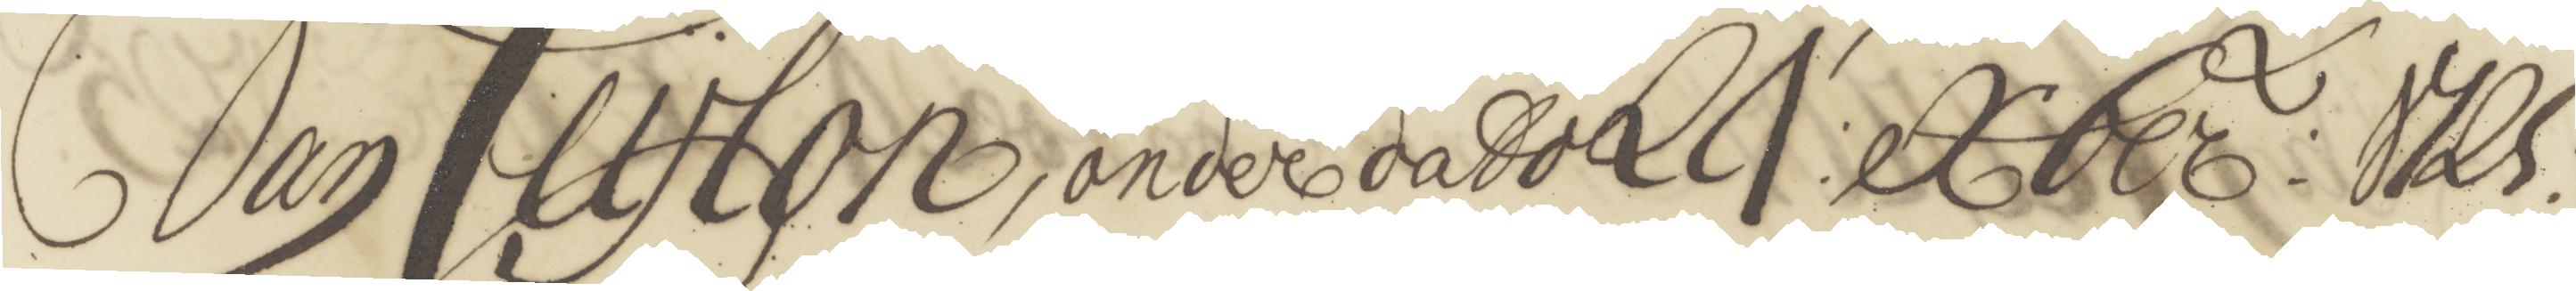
Van Ceijlon, onder dato 24:' xber: 1725:
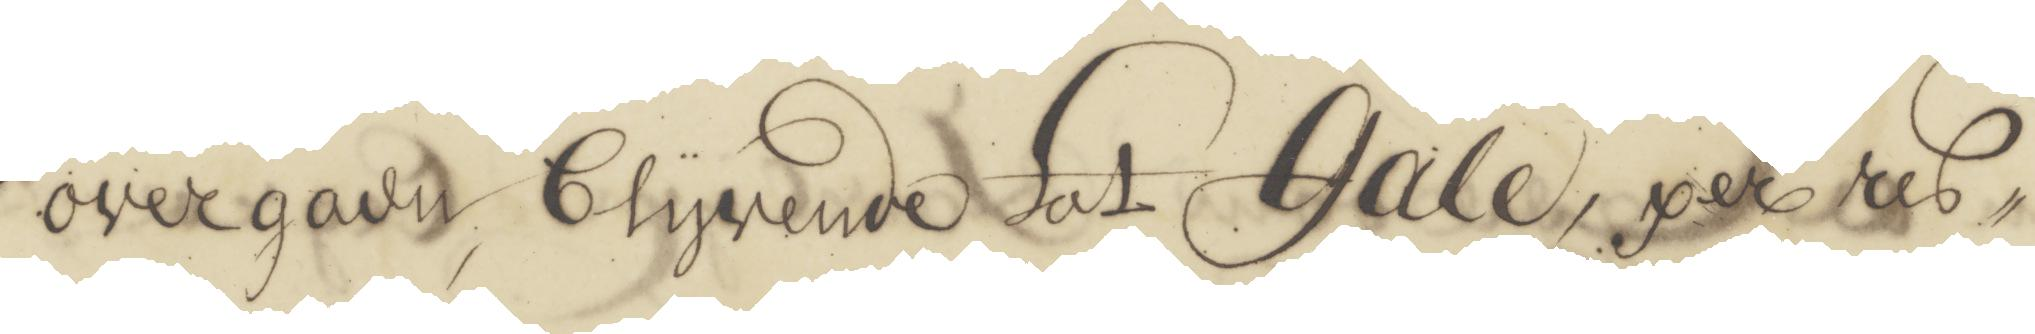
overgaen, blijvende tot Gale, per res„
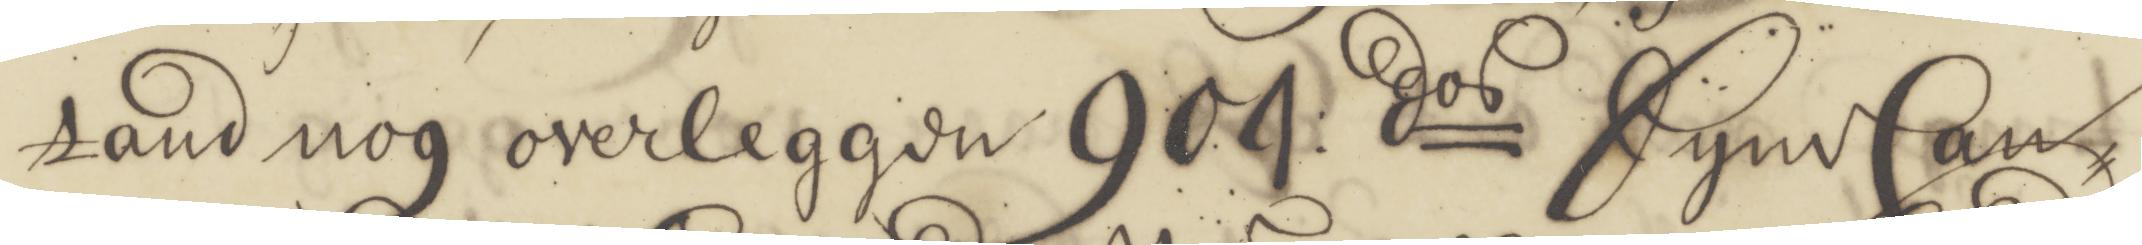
tand nog overleggen 904 d=os fijne Can„
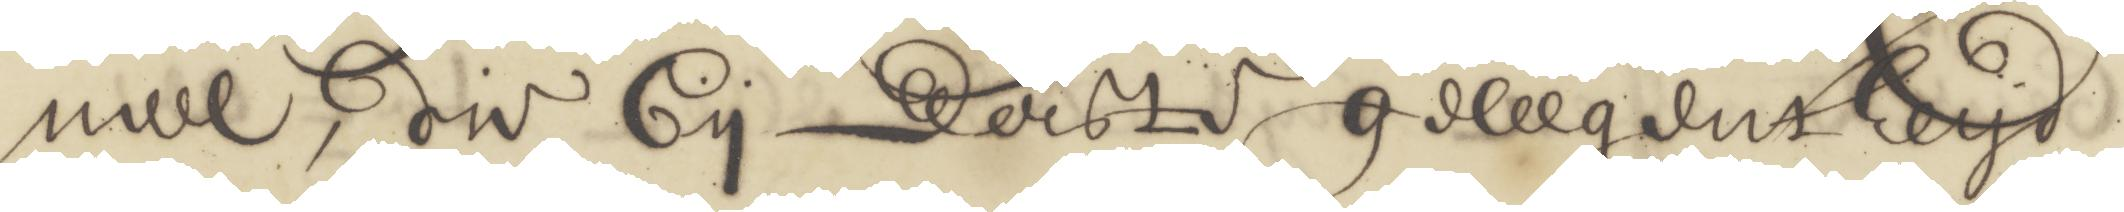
neel, die bij Eerste geleegentheijd
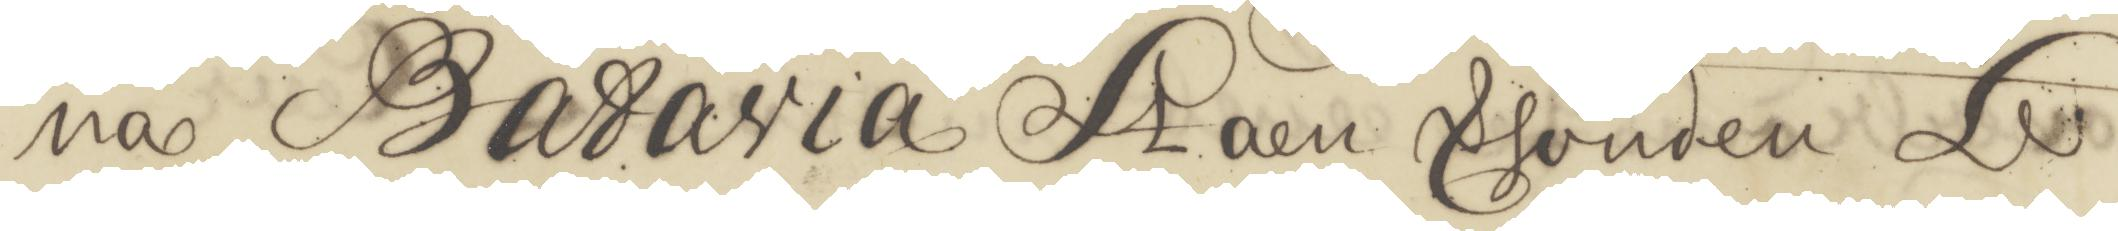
na Batavia Staen versonden te
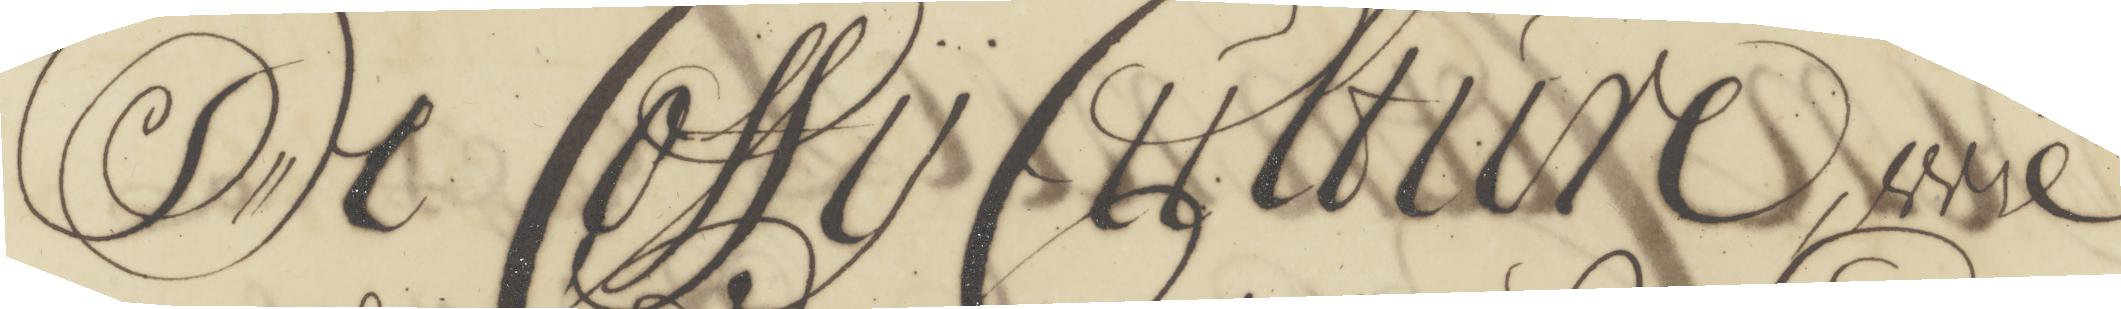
De Coffij Culture, wie
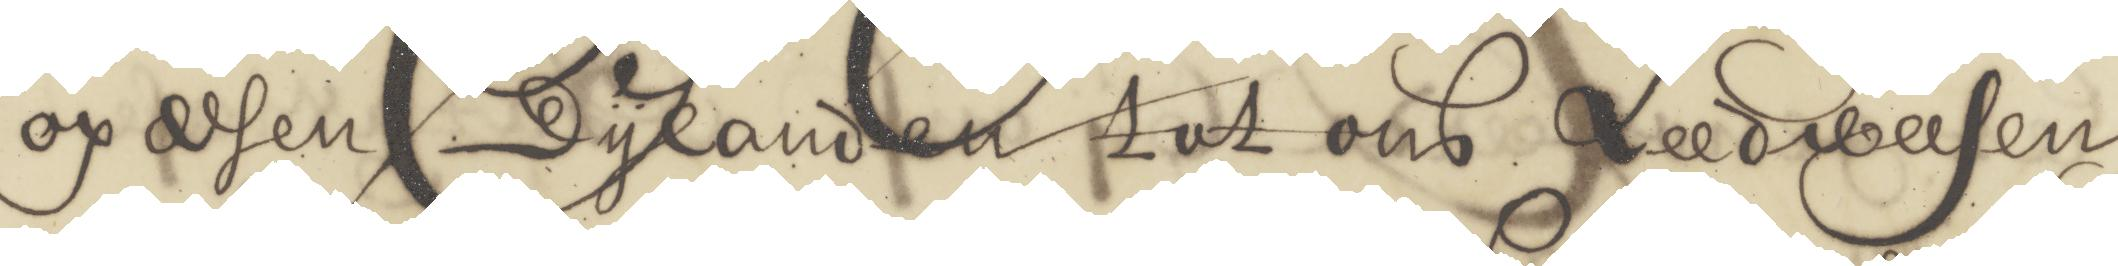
op desen Eijlanden tot ons Leedweesen
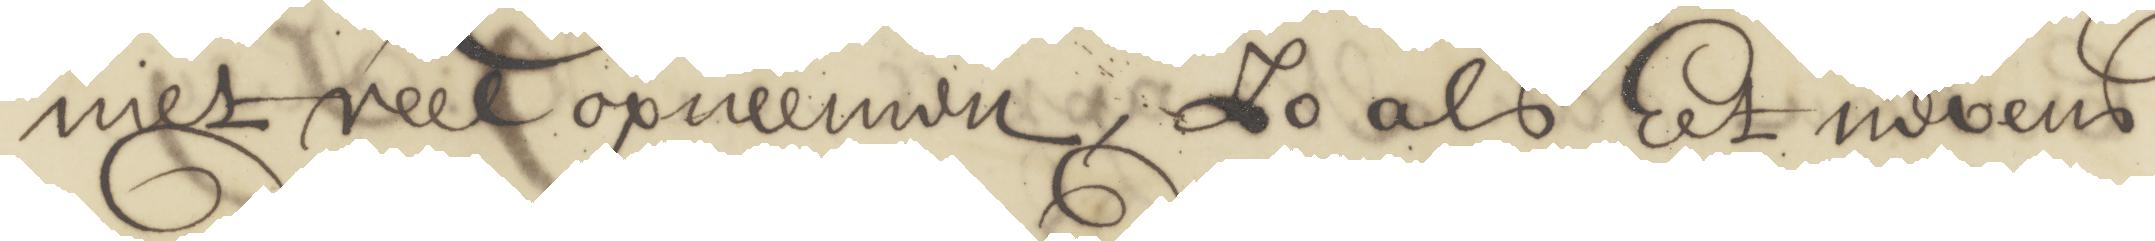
niet veel opneemen; zo als het nevens
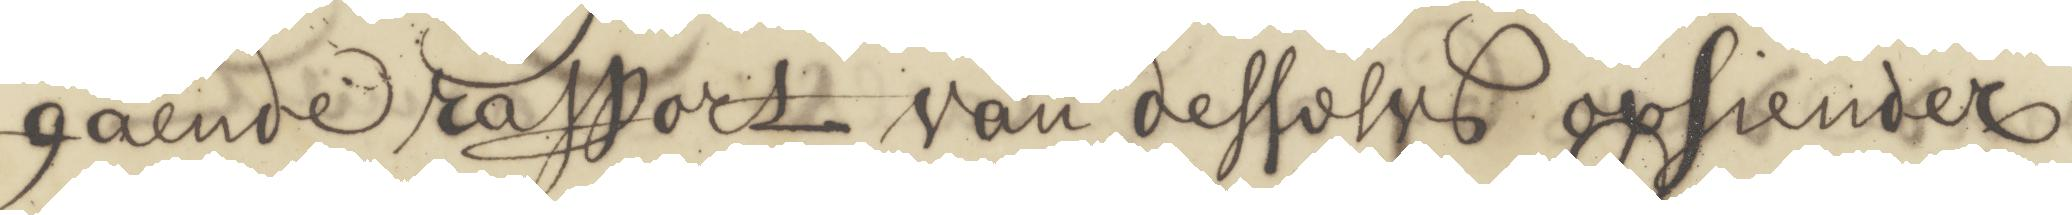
gaende rapport van desselvs opsiender
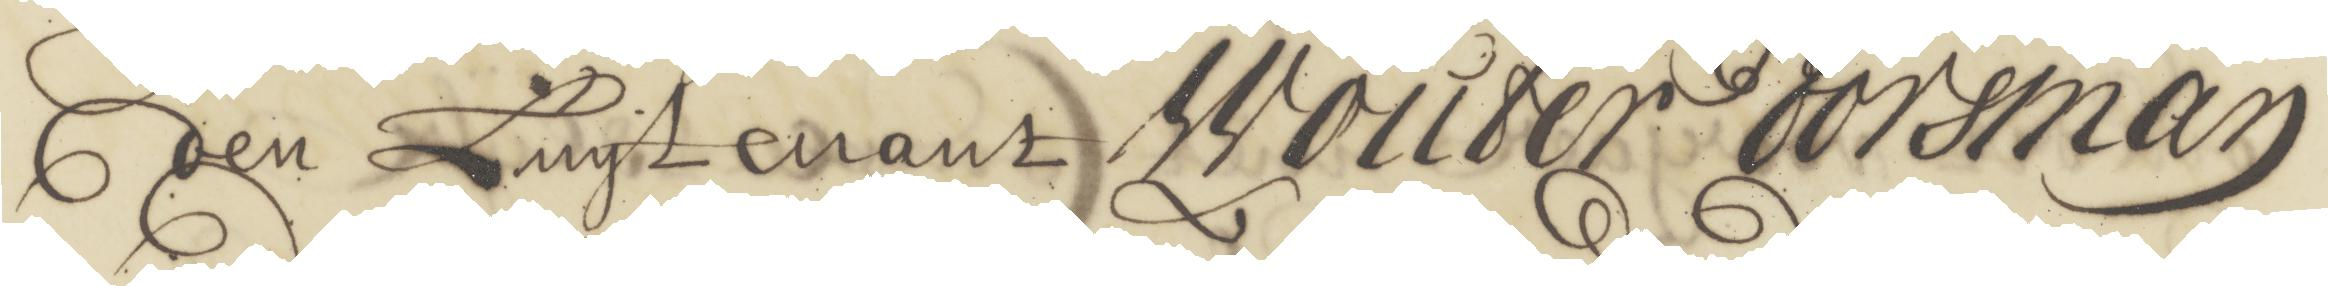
den Luijtenant Wouter dorsman
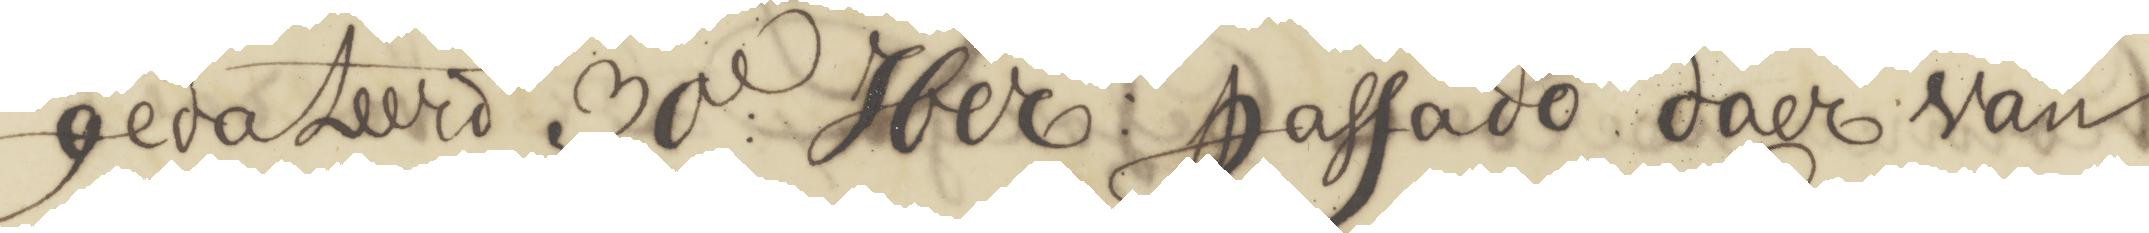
gedateerd, 30:e Iber:s passado daer van
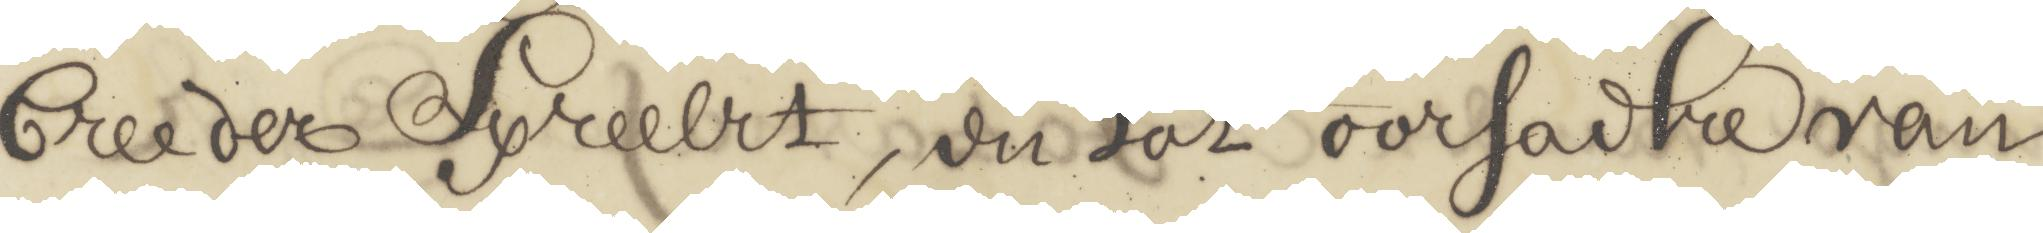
breeder spreekt, en tot oorsaeke van
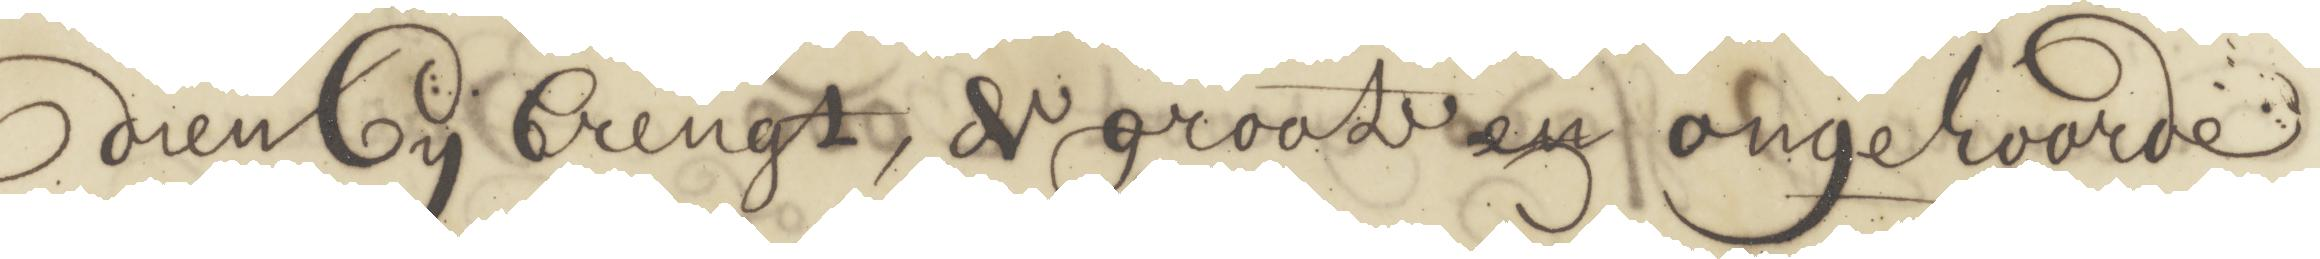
dien bij brengt, de groote en ongehoorde
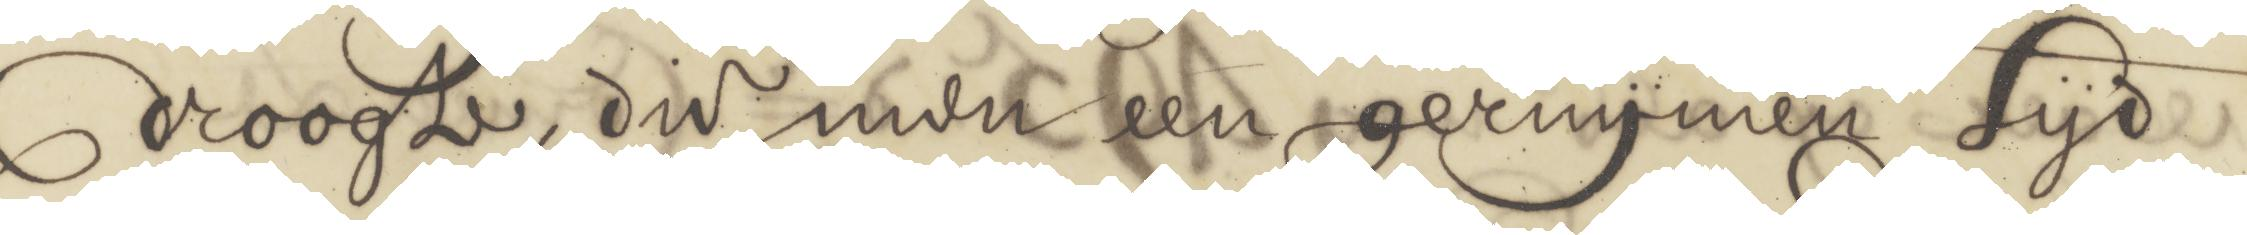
droogte, die men een geruijmen tijd
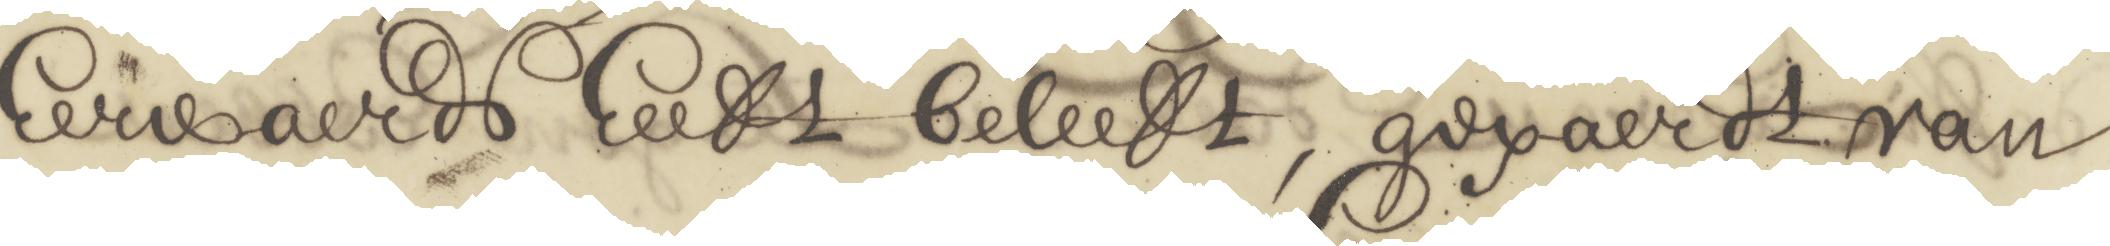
herwaerds heeft beleeft, gepaerdt van
